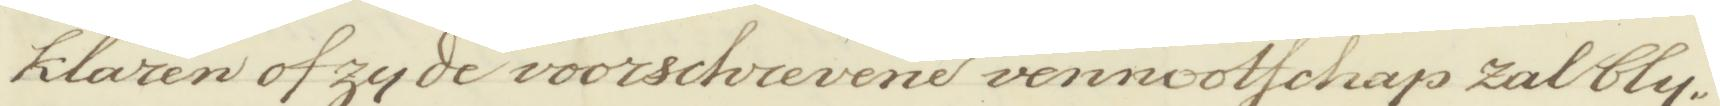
klaren of zyde voorschrevene vennootschap zal bly„
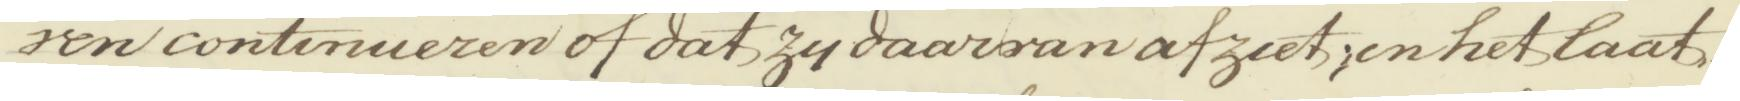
ven continueren of dat zy daarvan afziet; in het laat„
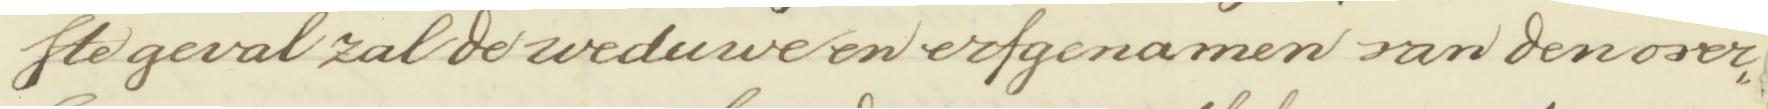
ste geval zal de weduwe en erfgenamen van den over„
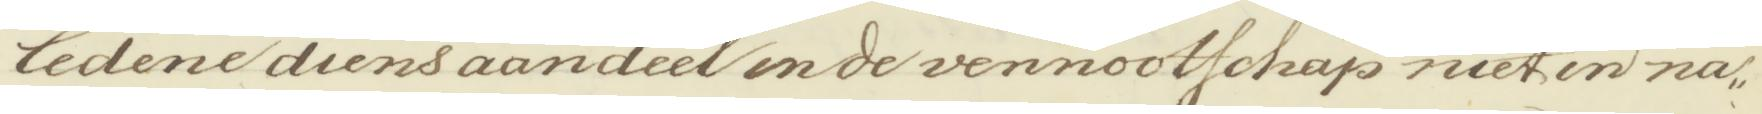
ledene diens aandeel in de vennootschap niet in na„
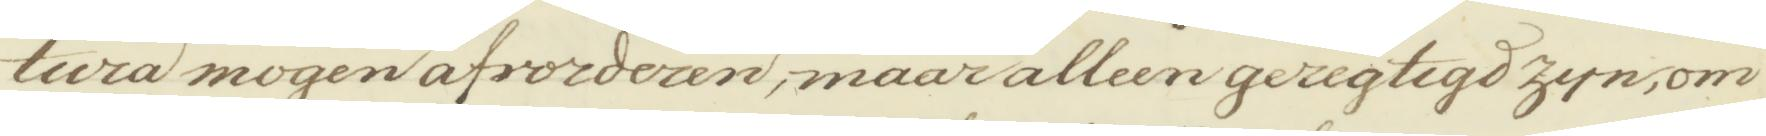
tura mogen afvorderen, maar alleen geregtigd zyn, om
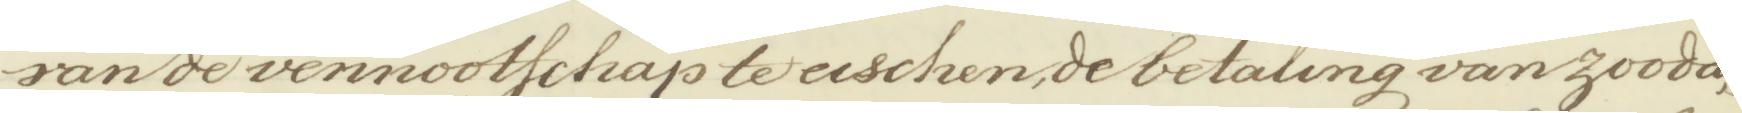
van de vennootschap te eischen, de betaling van zooda„
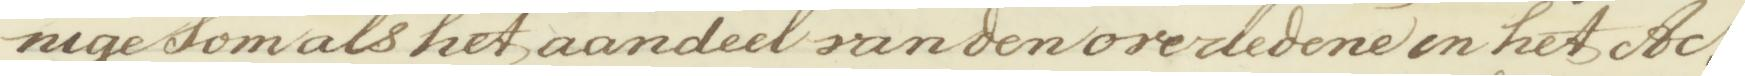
nige som als het aandeel van den overledene en het Ac
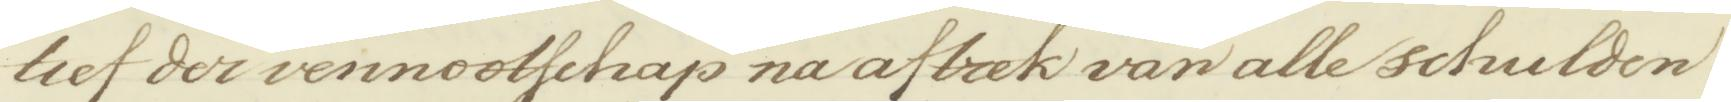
tief der vennootschap na aftrek van alle schulden
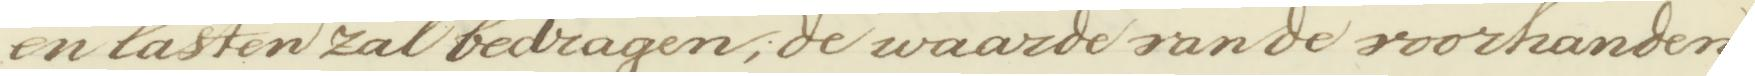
en lasten zal bedragen, de waarde van de voorhanden
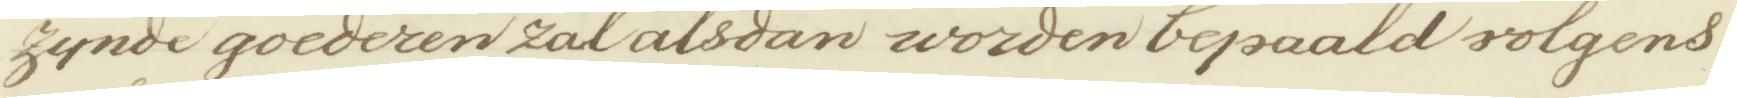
zynde goederen zal alsdan worden bepaald volgens
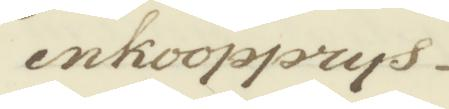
inkoopprys
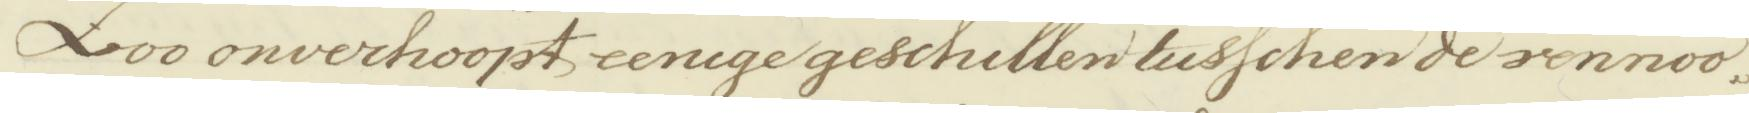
zoo onverhoopt eenige geschillen tusschen de vennoo„
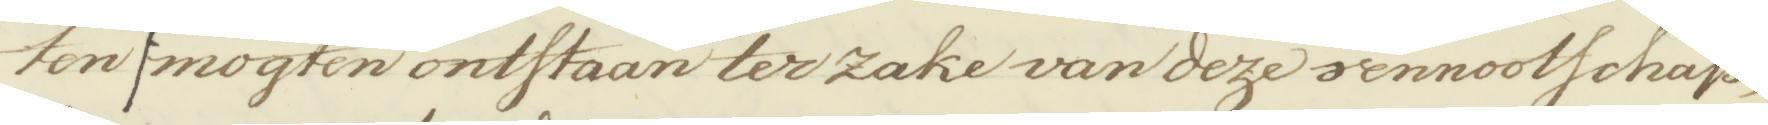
ten ¶mogten ontstaan ter zake van deze vennootschap,
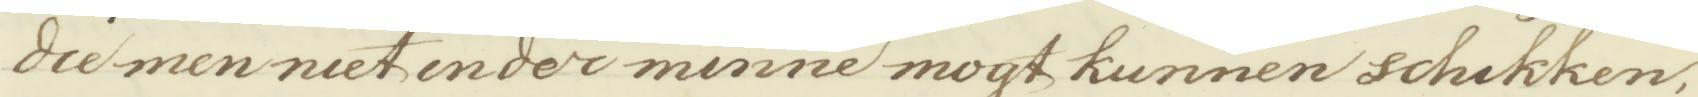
die men niet inder minne mogt kunnen schikken,
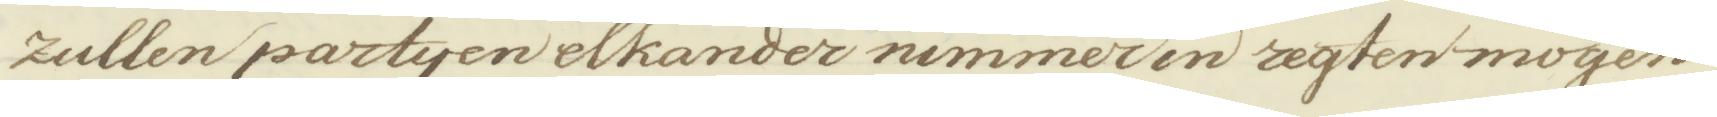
zullen partyen elkander nimmer in regten mogen
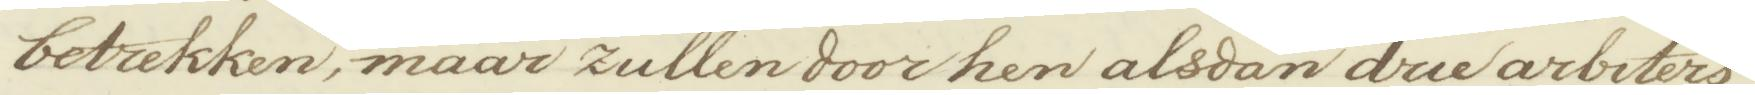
betrekken, maar zullen door hen alsdan drie arbiters
